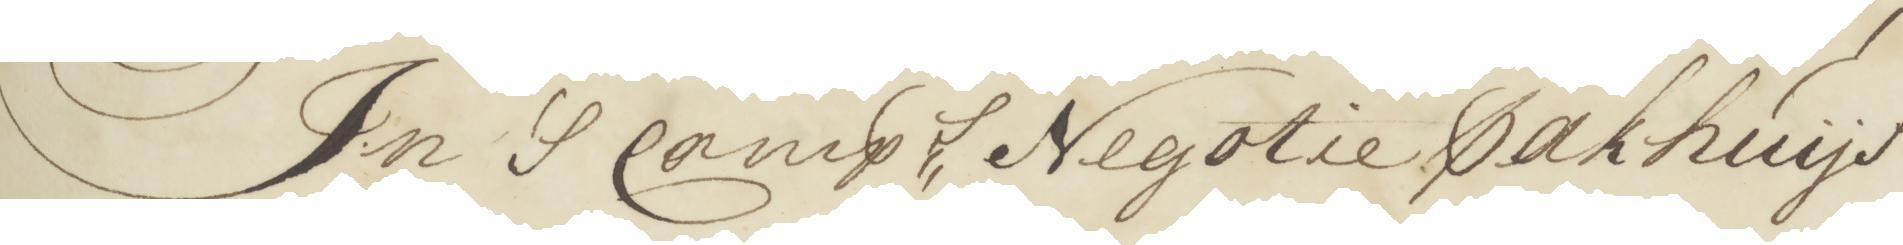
Jn ’s Comp„s Negotie Pakhuijs
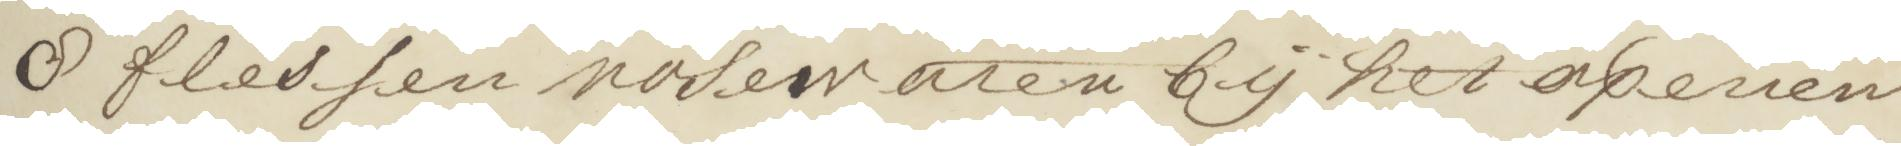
8 flessen rosewater bij het openen
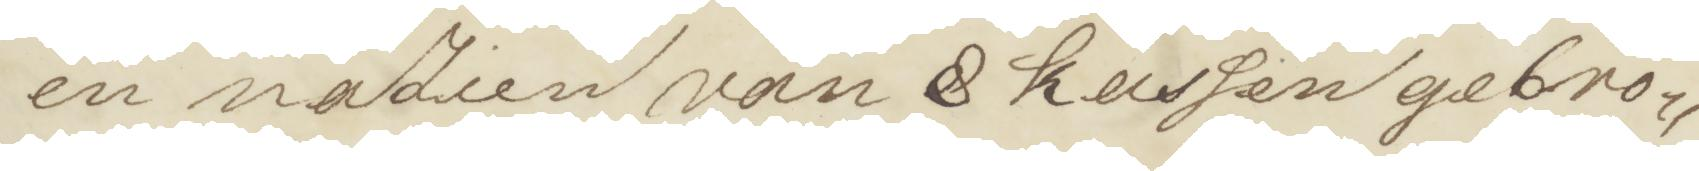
en nazien van 8 kassen gebro„
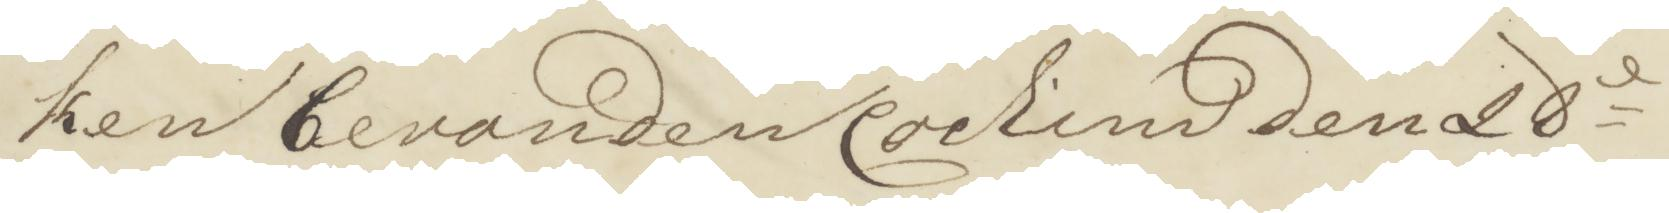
ken bevonden cochim den 28=e
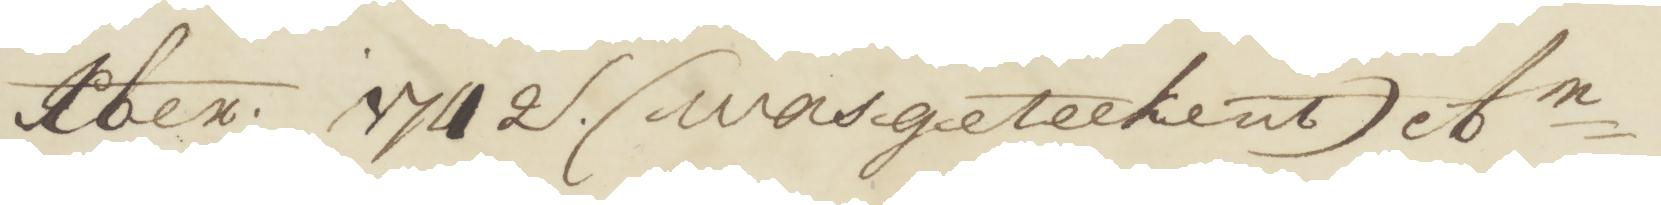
xber: 1742. (was geteekent) A=n
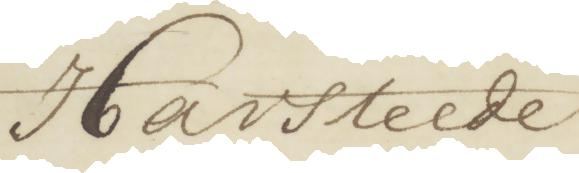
Havsteede
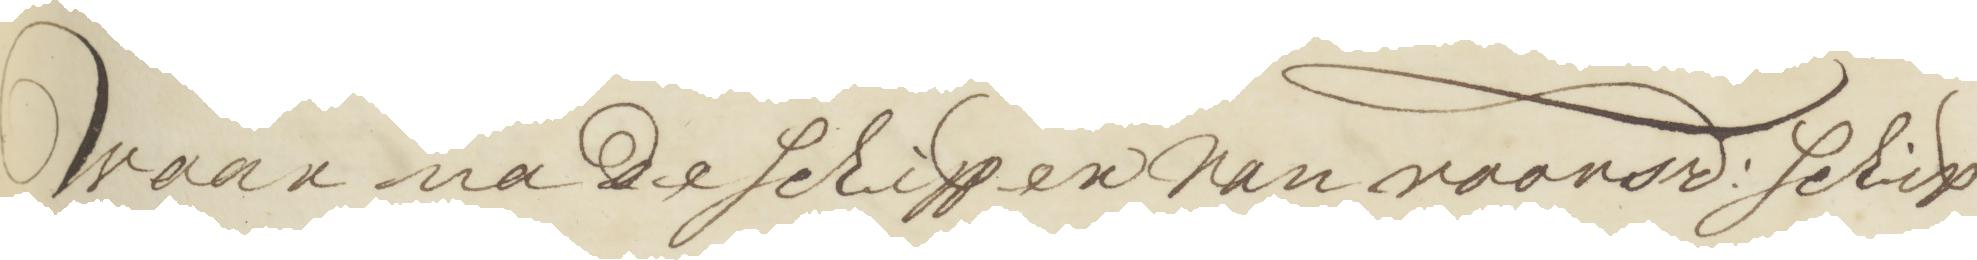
Waar na de schipper van voorsz: schip
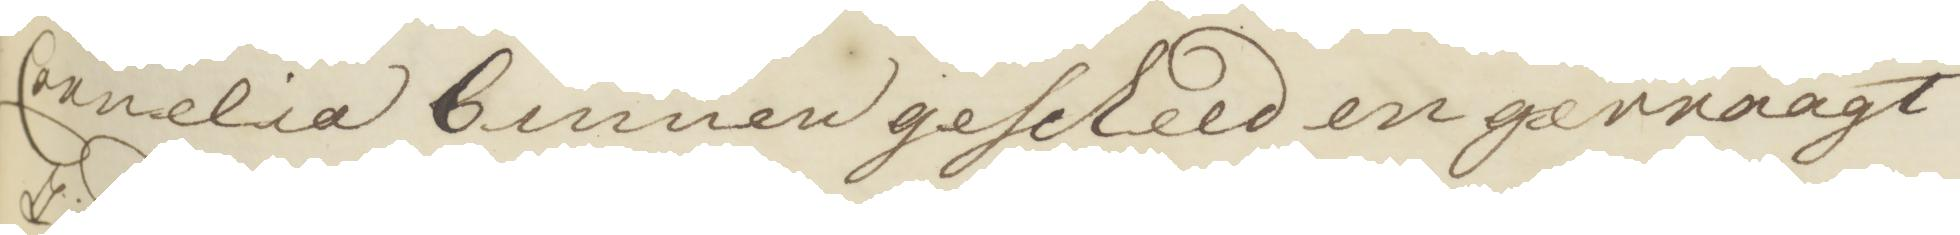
Cornelia binnen gescheld en gevraagt
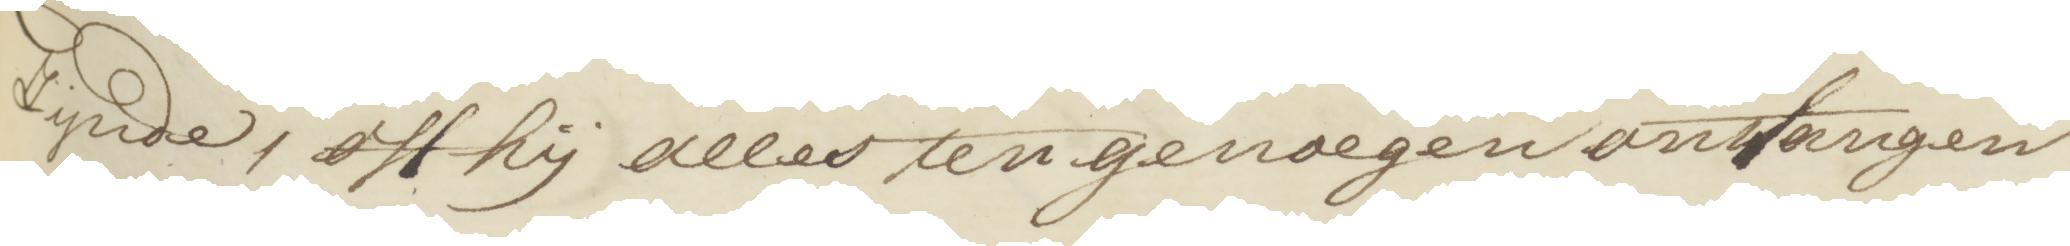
zijnde, off hij alles ten genoegen ontfangen
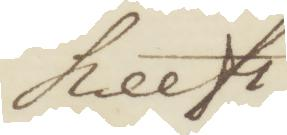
heeft,
